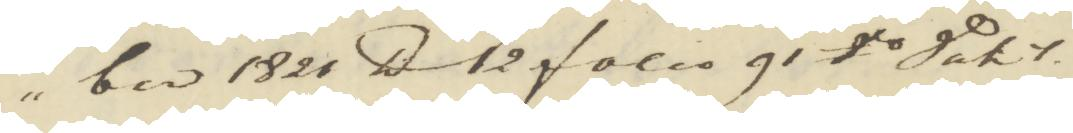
„ber 1821 D 12 folio 91 V=o Vak 7
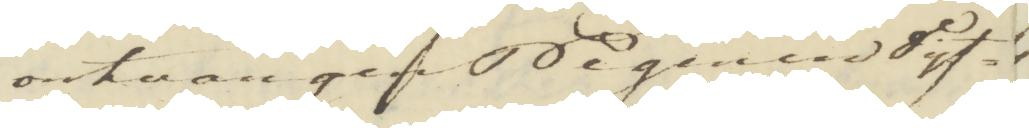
ontvangen Negenen Vijf=
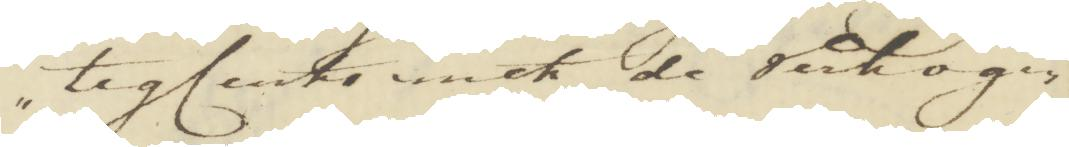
„tig Cents met de verhogin
